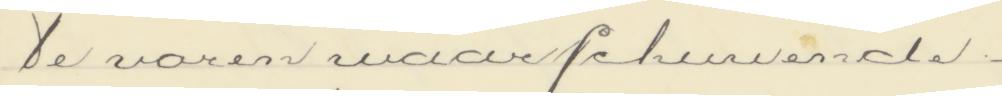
te voren waarschuwende.
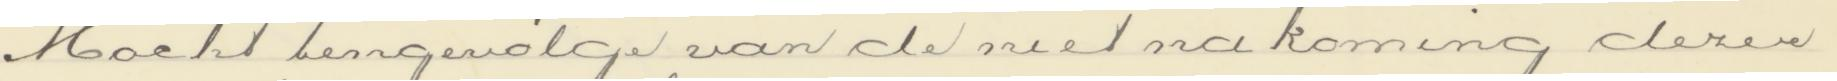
Mocht ten gevolge van de niet nakoming dezer
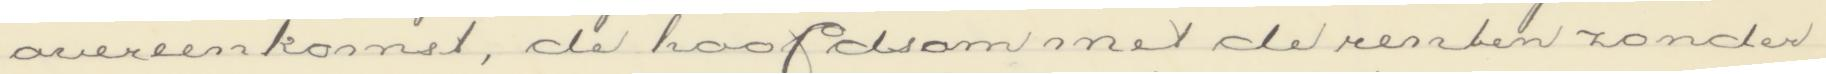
overeenkomst, de hoofdsom met de renten zonder
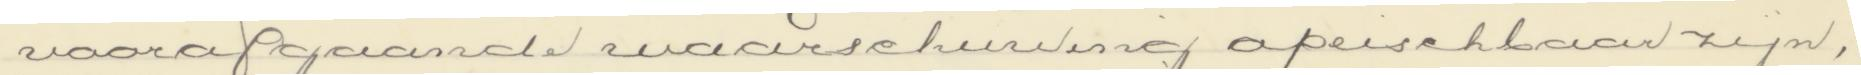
voorafgaande waarschuwing opeischbaar zijn,
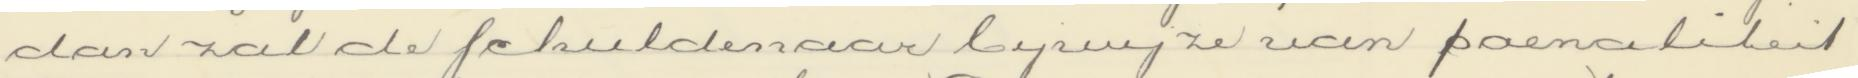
dan zal de schuldenaar bij wijze van poenaliteit
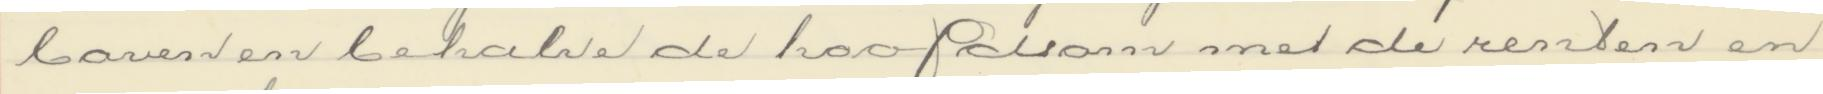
boven en behalve de hoofdsom met de renten en
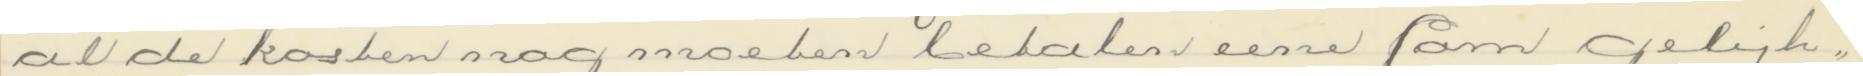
al de kosten nog moeten betalen eene som gelijk„
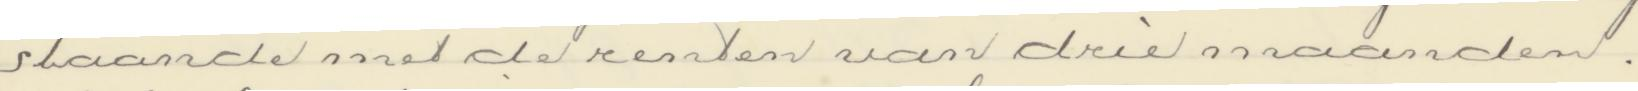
staande met de renten van drie maanden
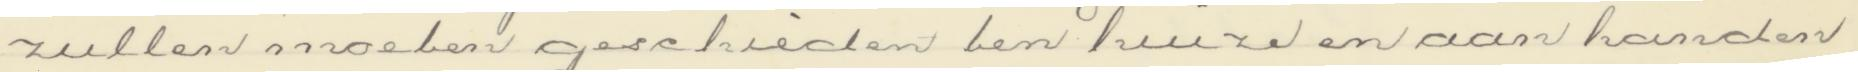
zullen moeten geschieden ten huize en aan handen
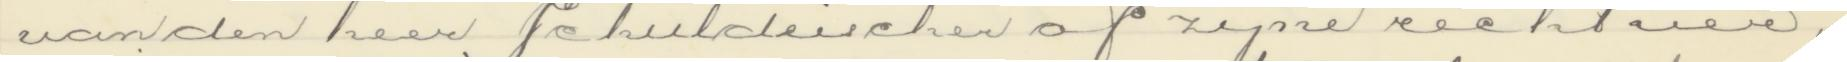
van den heer schuldeischer of zijne rechtver„
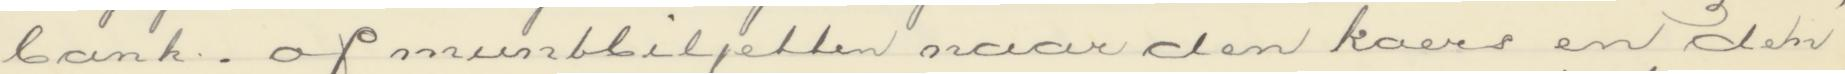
bank. - of muntbiljetten naar den koers en den
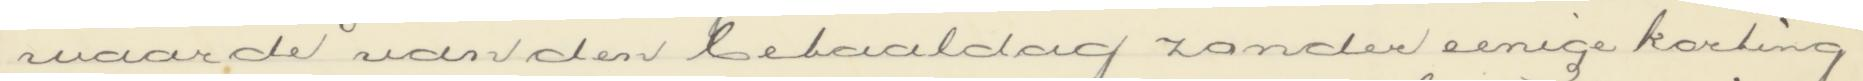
waarde van den betaaldag zonder eenige korting
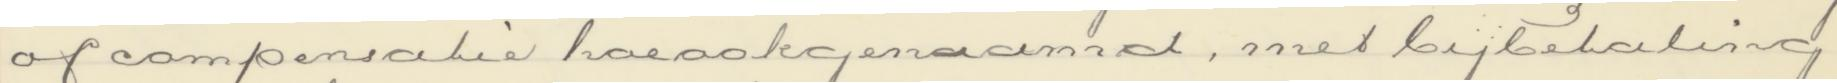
of compensatie hoe ook genaamd, met bijbetaling
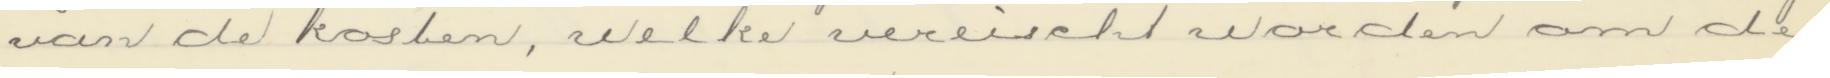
van de kosten, welke vereischt worden om de
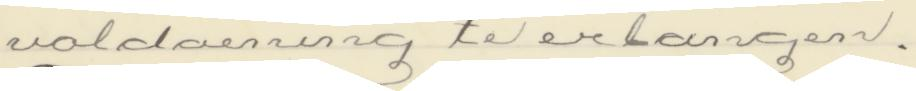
voldoening te erlangen.
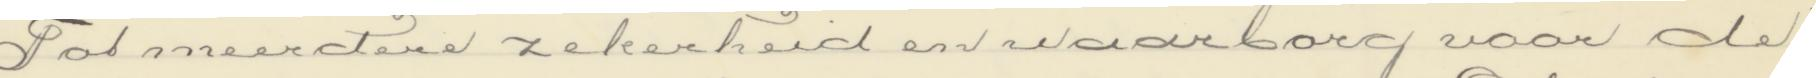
Tot meerdere zekerheid en waarborg voor de
